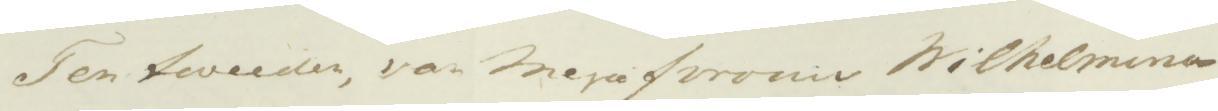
Ten tweeden, van Mejufvrouw Wilhelmina
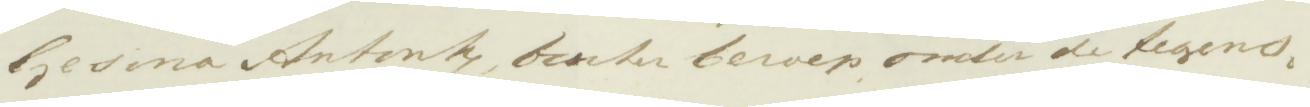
Gesina Antink, buiten beroep, onder de tegens„
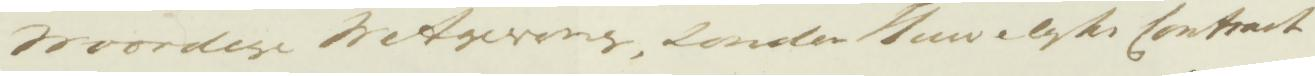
woordige wetgeving, zonder Huwelyks Contract
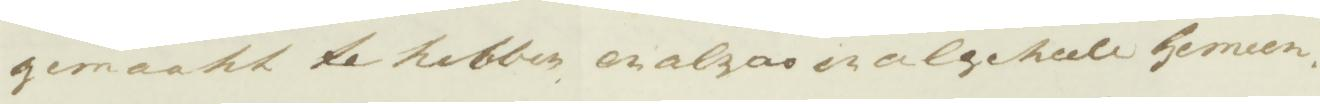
gemaakt te hebben, en alzoo in algeheele gemeen
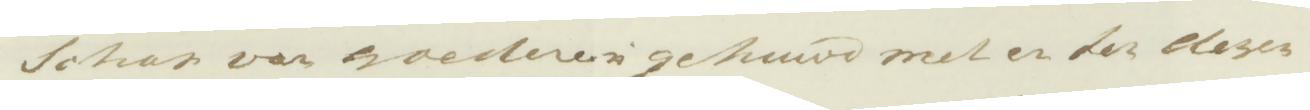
schap van goederen gehuwd met en ten dezen
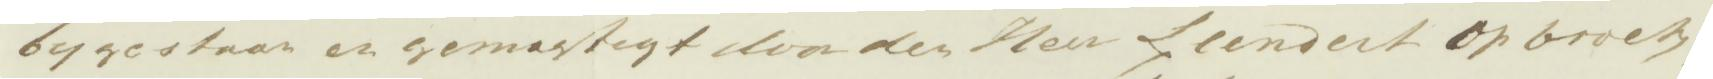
bygestaan en gemagtigt door den Heer Leendert opbroek,
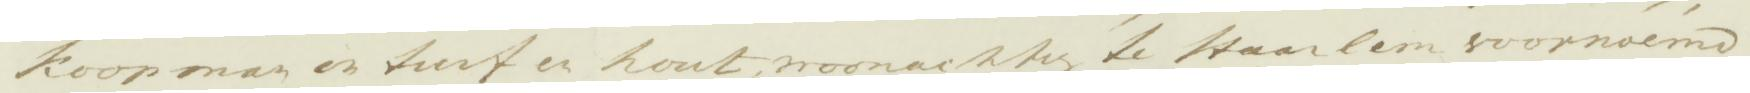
koopman in turf en hout, woonachtig te Haarlem voornoemd
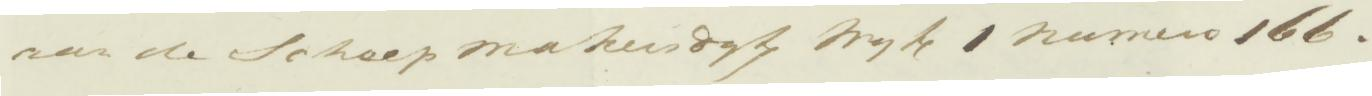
aan de scheep makersdyk wyk 1 numero 166
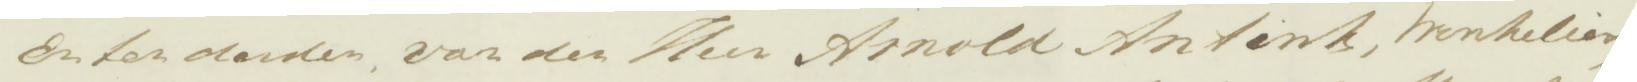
En ten derden, van den Heer Arnold Antink, winkelier,
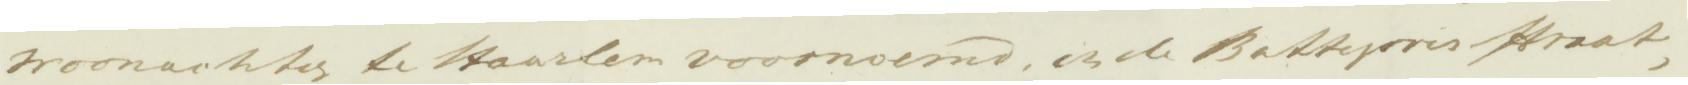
woonachtig te Haarlem voornoemd, in de Battejoris straat,
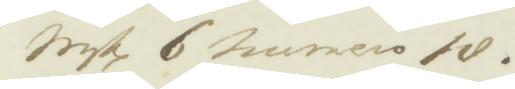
wyk 6 numero 18
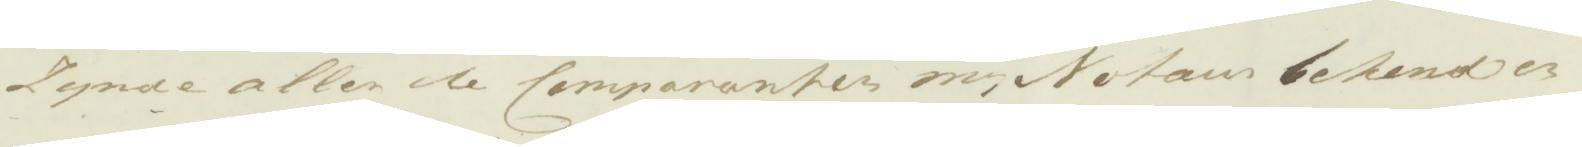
Zynde allen de Comparanten my Notaris bekend en
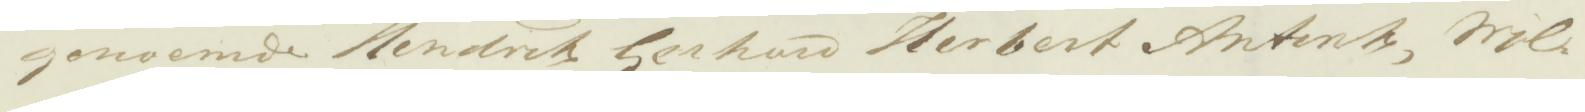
genoemde Hendrik Gerhard Herbert Antink, Wil„
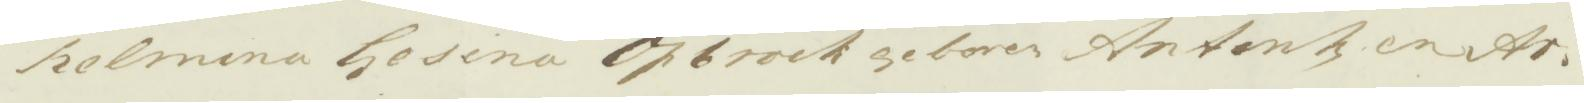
helmina Gesina Opbroek geboren Antink en Ar„
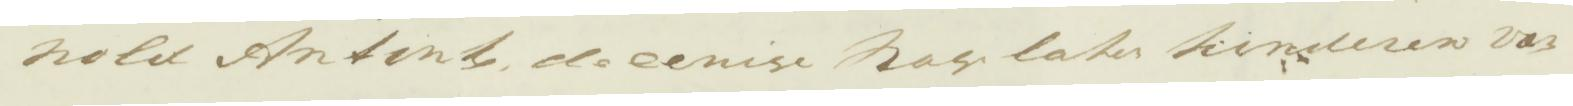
nold Antink, de eenige Nagelaten kinderen van
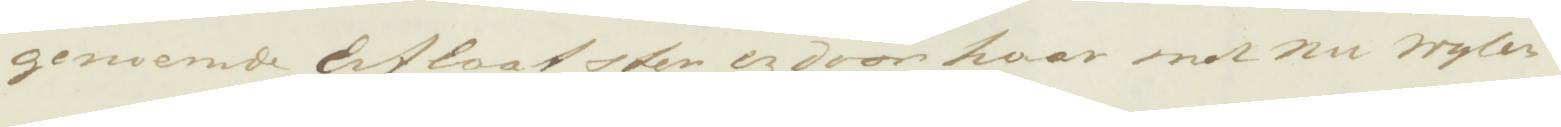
genoemde Erflaatster, en door haar met nu wylen
